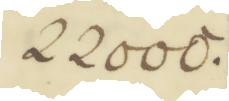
22000.
